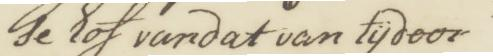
se hof van dat van tijdoor
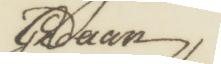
Gedaan,
